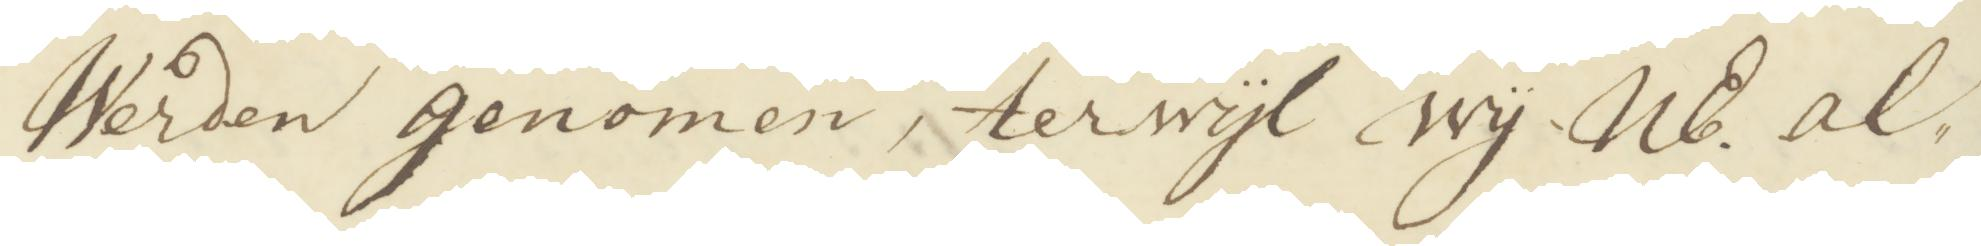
werden genomen, terwijl wij UE: al„
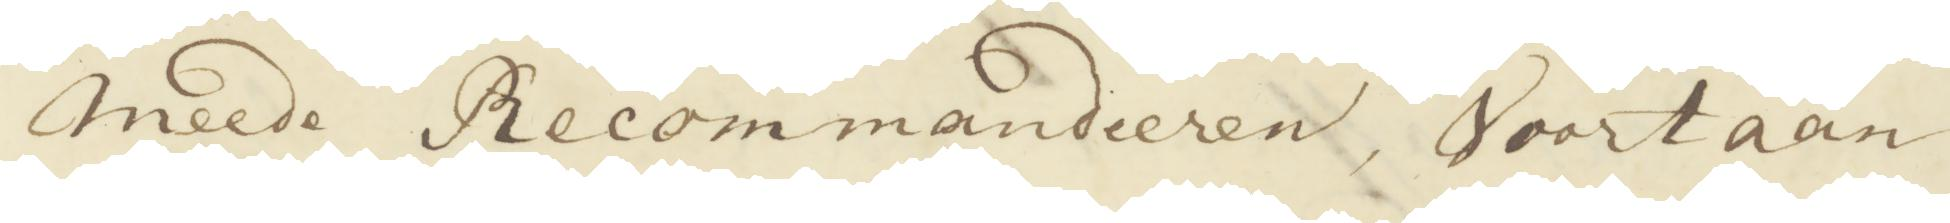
meede Recommandeeren, voortaan
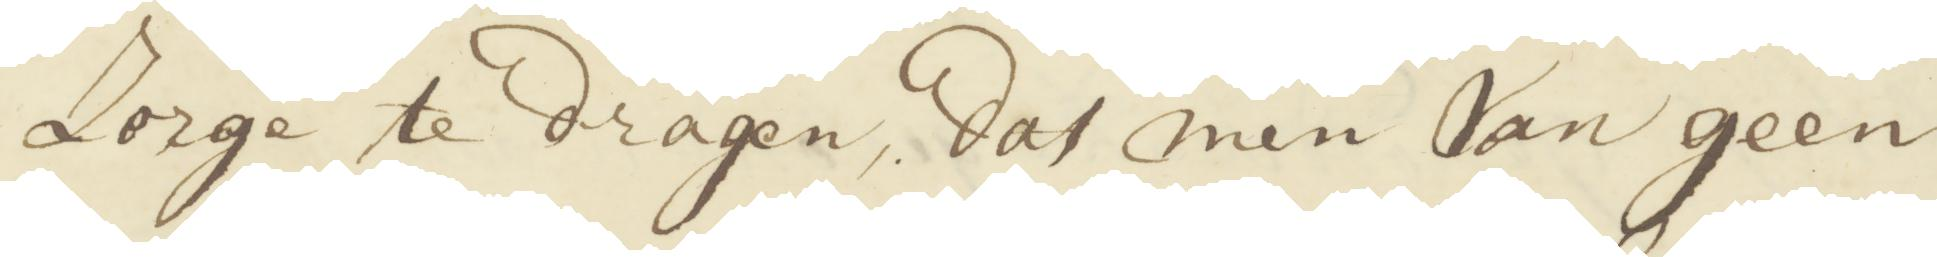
Zorge te dragen, dat men van geen
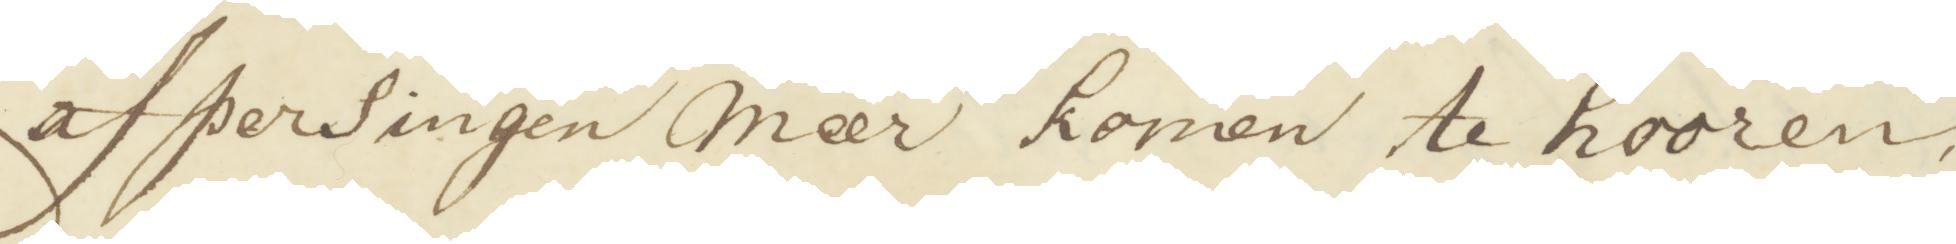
afpersingen meer komen te hooren,
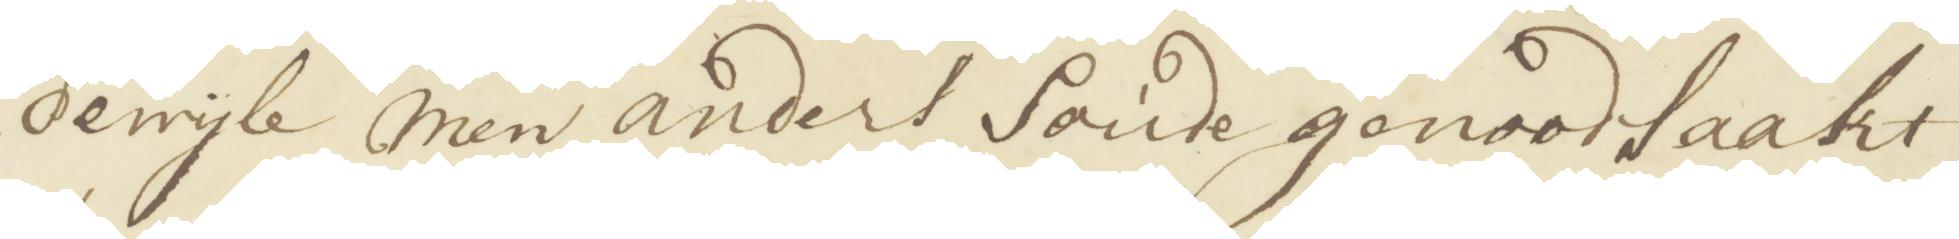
, dewijle men anders soude genoodsaakt
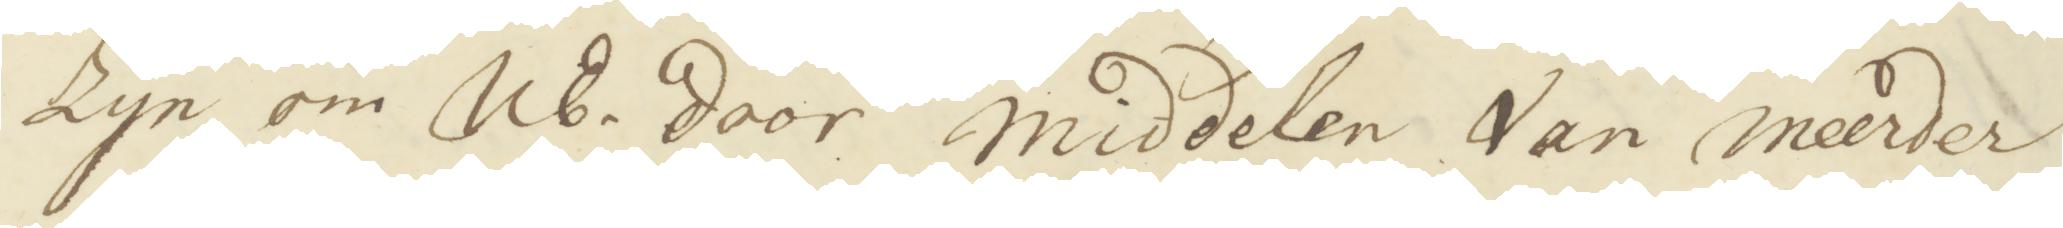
zijn om UE: door middelen van meerder
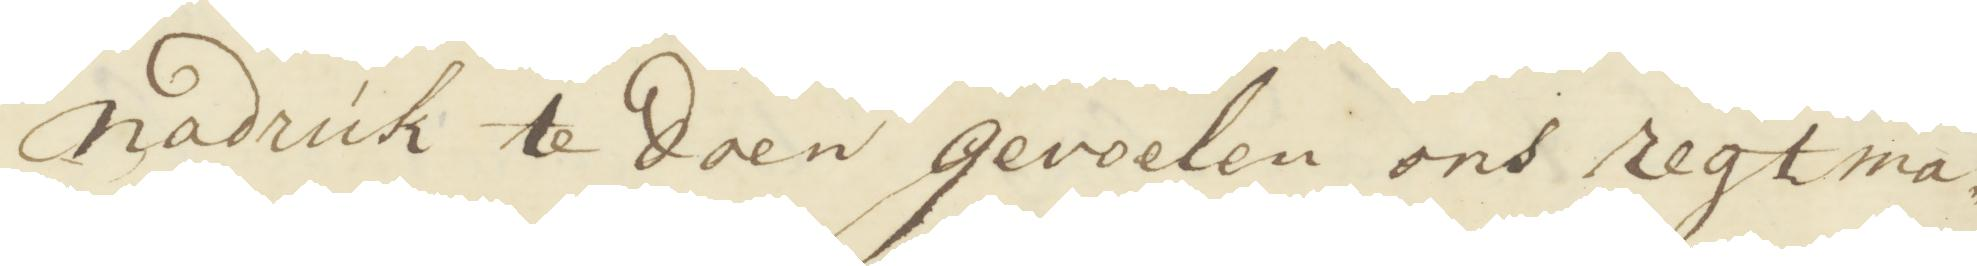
nadruk te doen gevoelen ons regt ma„
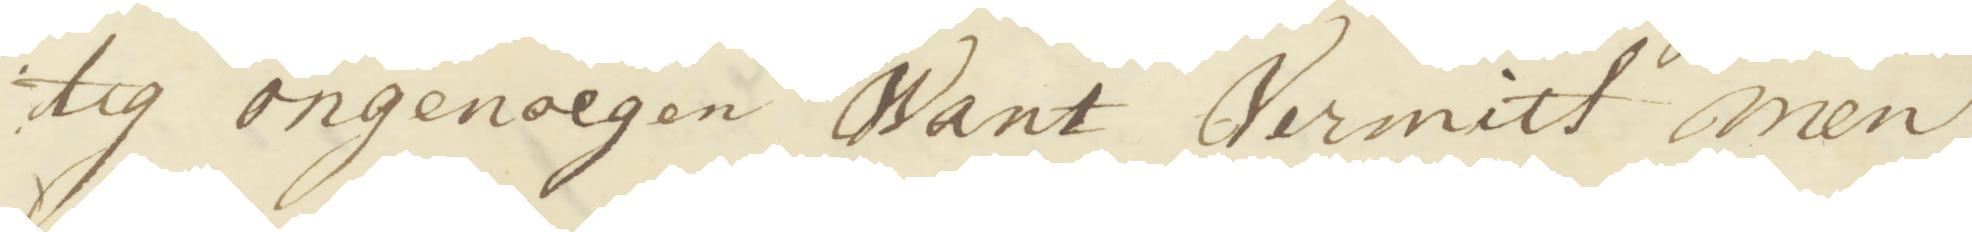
„tig ongenoegen want vermits men
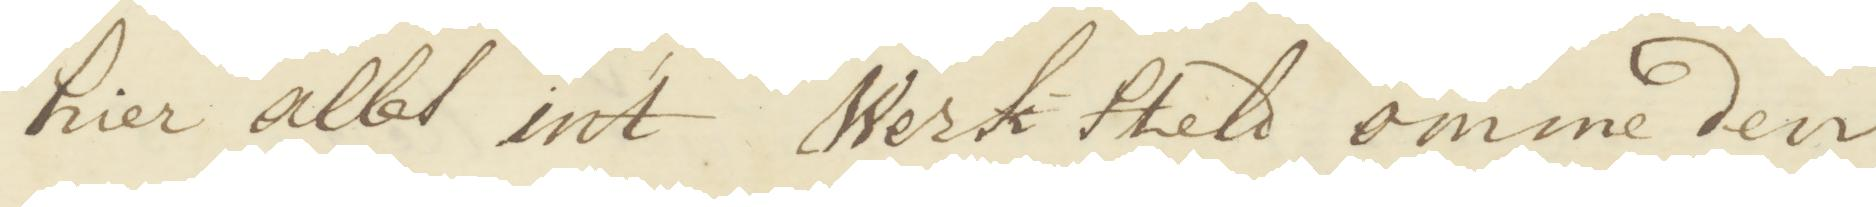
hier alles in’t werk steld omme den
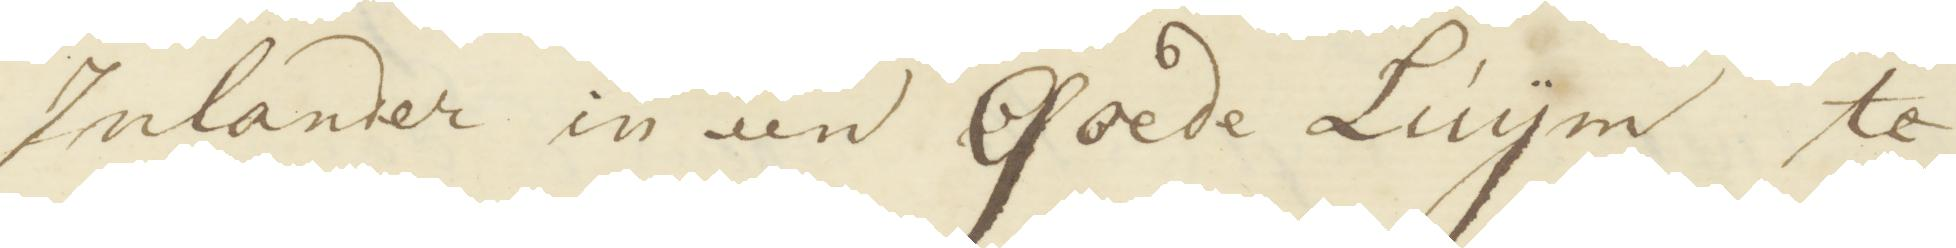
Jnlander in een Goede Luijm te
